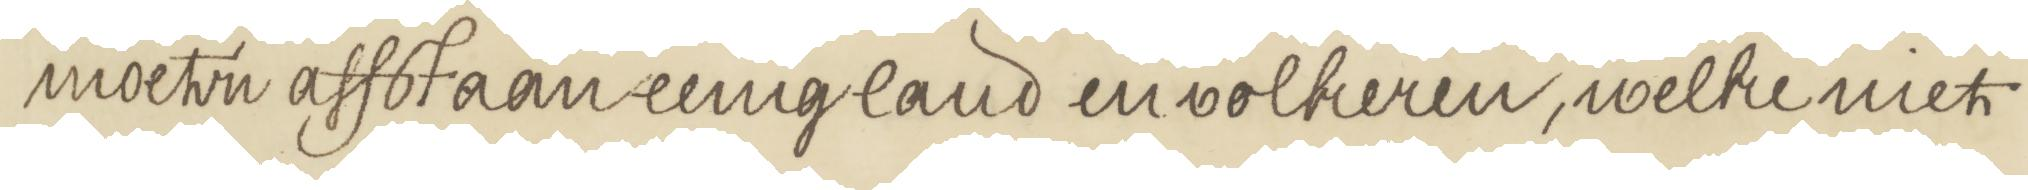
moeten affstaan eenig land en volkeren, welke niet
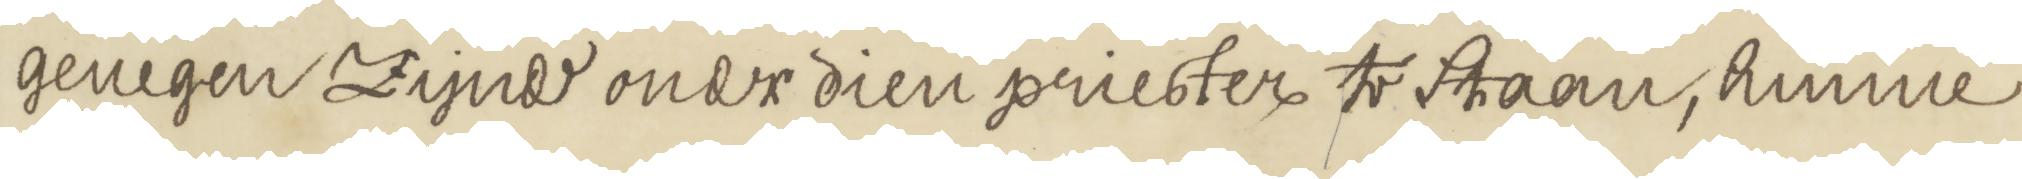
genegen zijnde onder dien priester te staan, hunne
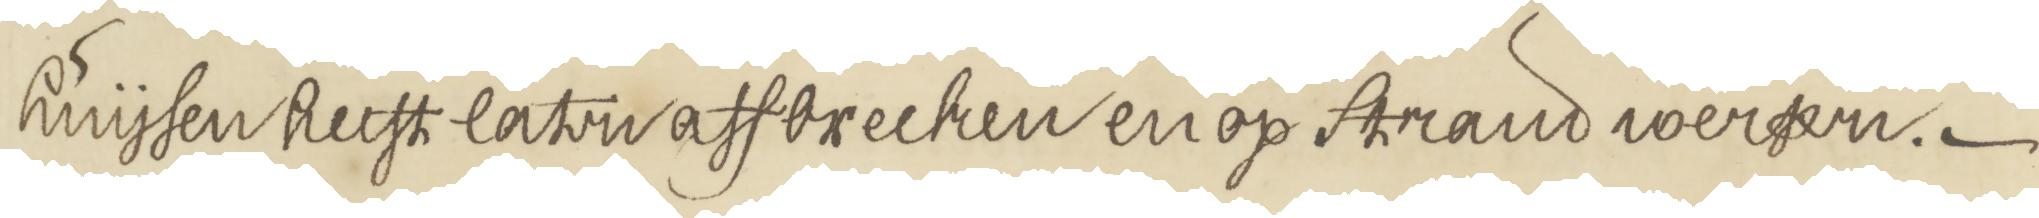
huijsen heeft laten affbreeken en op strand werpen. —
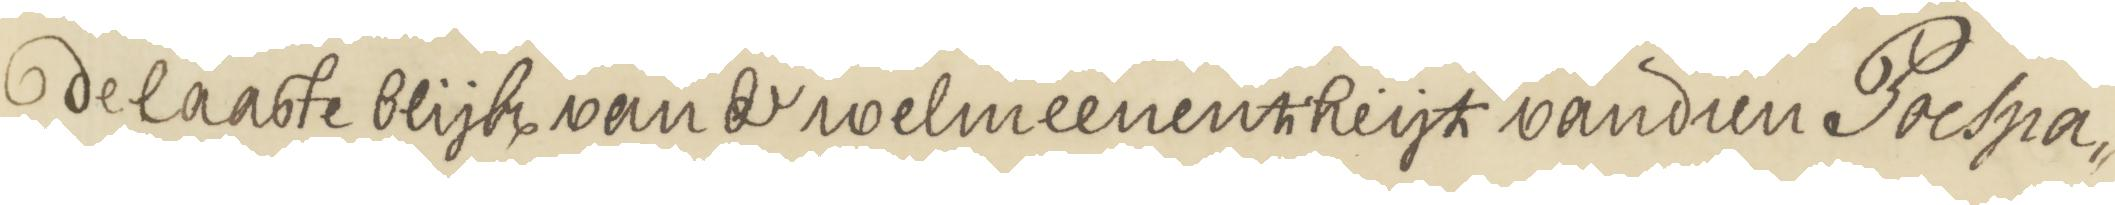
de laaste blijk van de welmeenentheijt van dien Poespa„
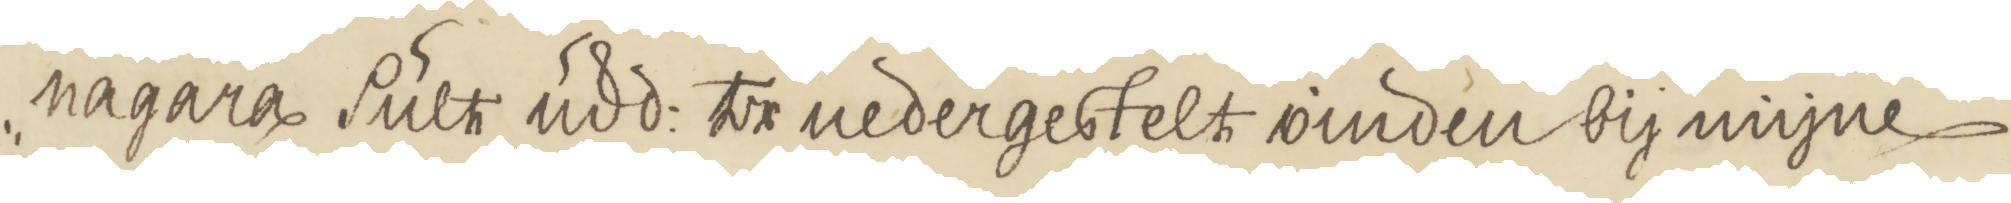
„nagara sult uEd: ter nedergestelt vinden bij mijne
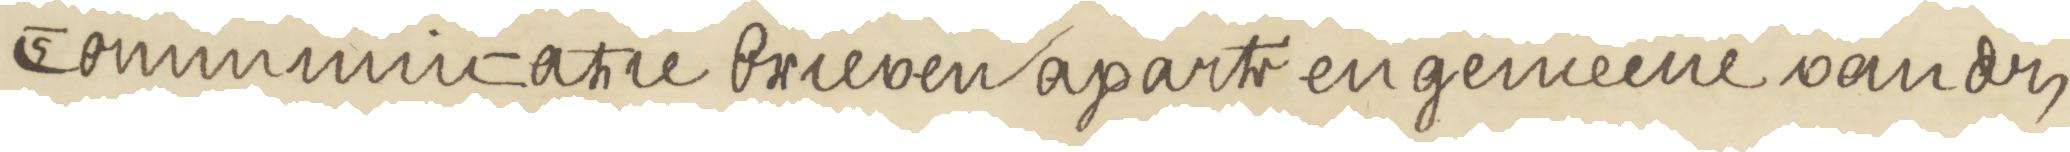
communicatie brieven aparte en gemeene van den
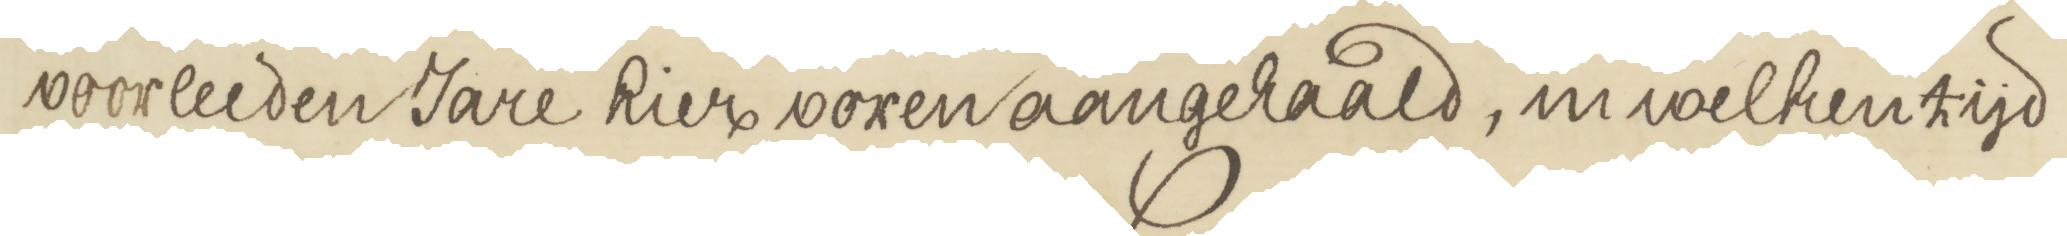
voorleeden Jare hier voren aangehaald, in welken tijd
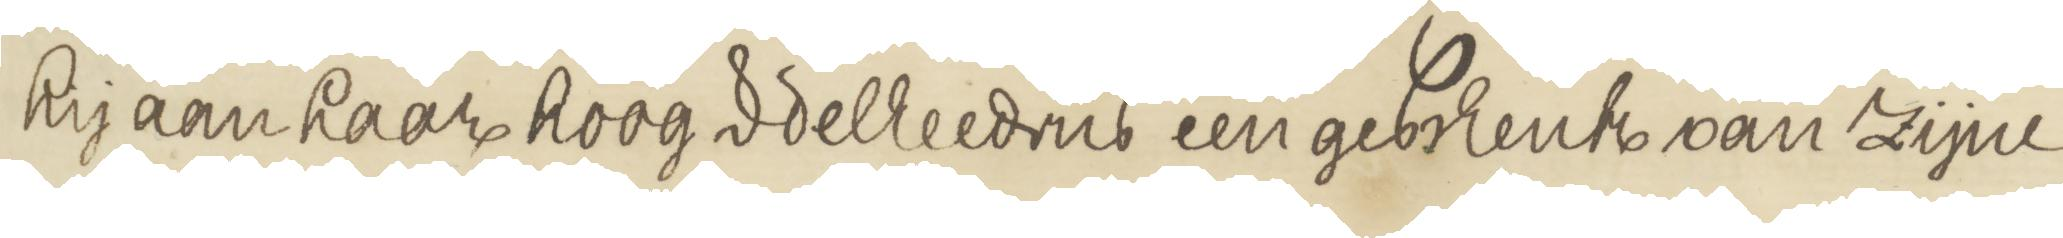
hij aan haar hoog Edelheedens een geschenk van zijne
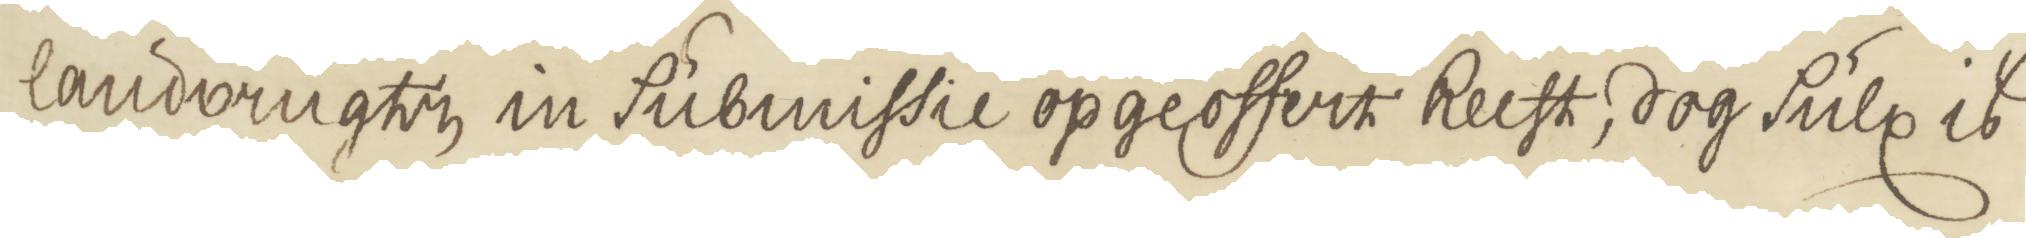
landvrugten in submissie opgeoffert heeft, dog sulx is
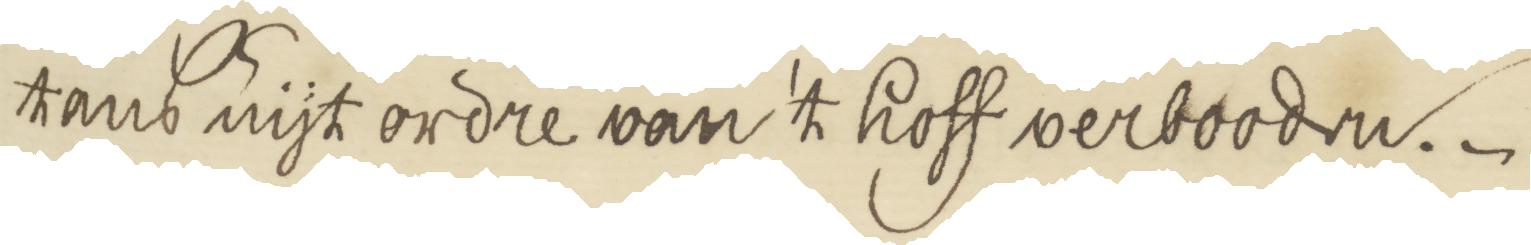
tans uijt ordre van ’t hoff verbooden. —
